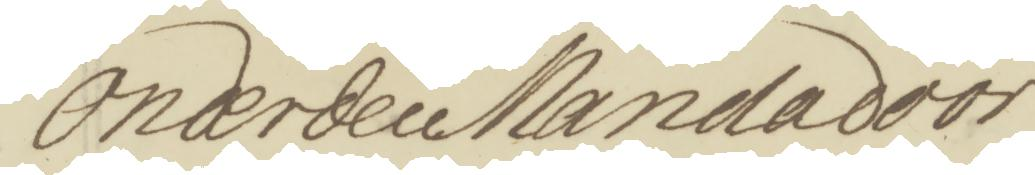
Onder den Nandadoor
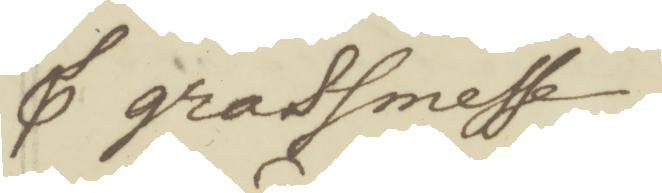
ps grassmesse
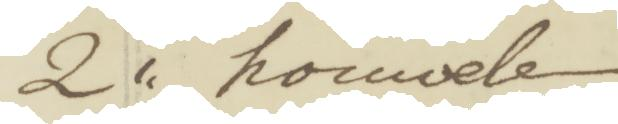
2 „ houwele
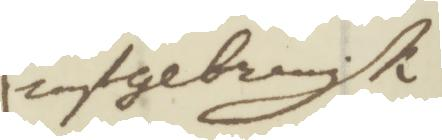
in t gebruyk
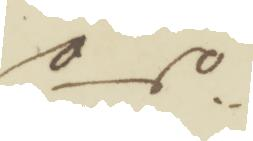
d.o d.o
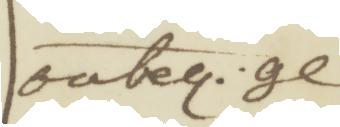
onbeq: ge
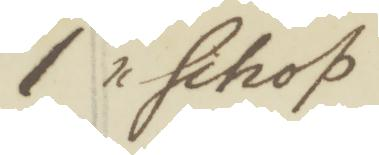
1 „ schop
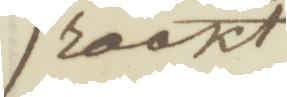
raakt
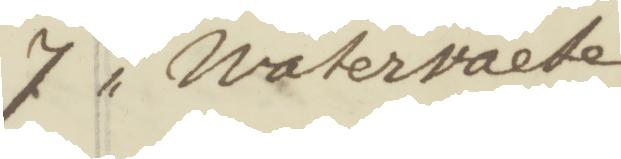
7 „ Watervaete
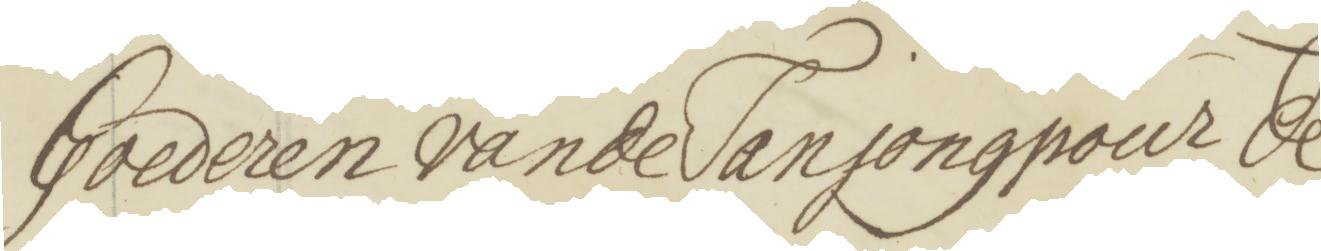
Goederen vande Tanjongpour de
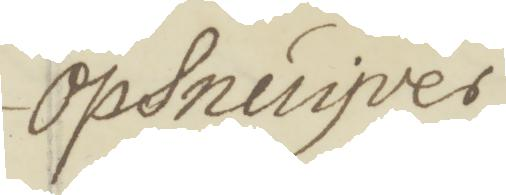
opsnuijver
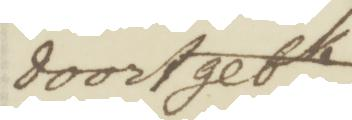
door t geb.k
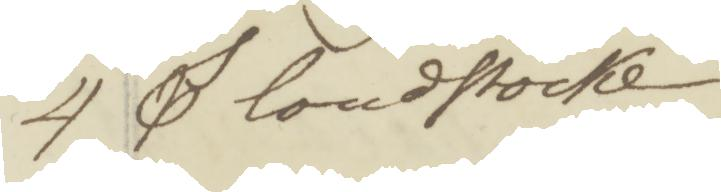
4 ps loodstocke
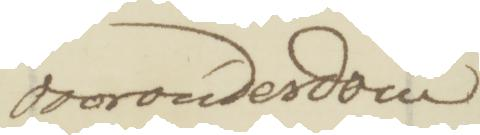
door ouderdom
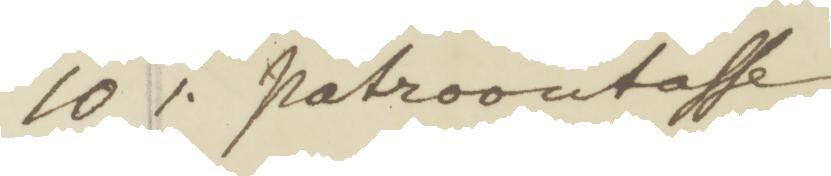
10 „ patroontasse
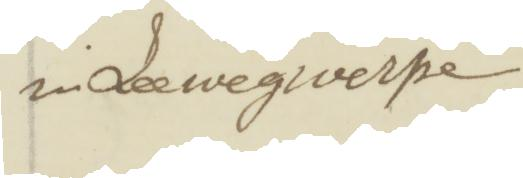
in See wegwerpe
